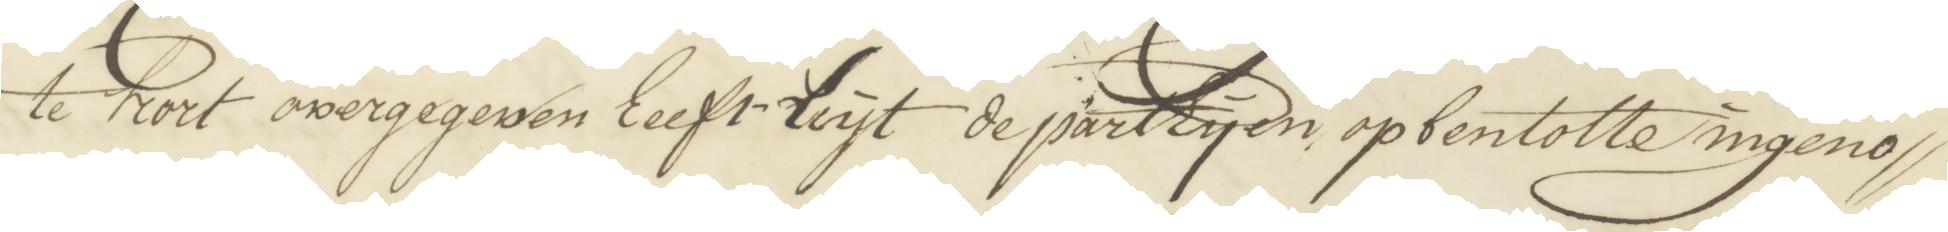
te kort overgegeven heeft uijt de parthijen, op bentotte ingeno„
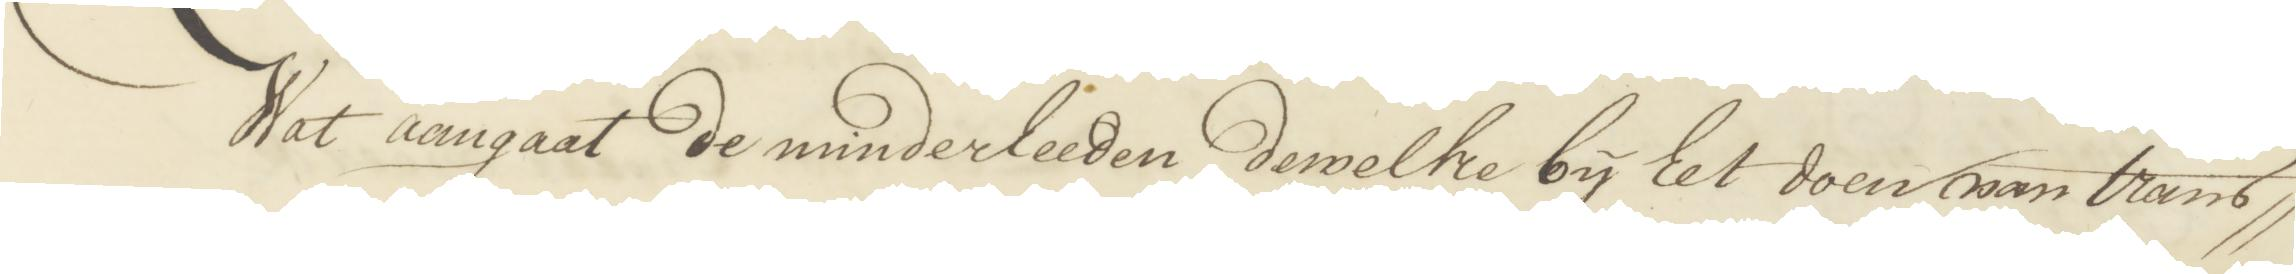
Wat aangaat de minderheeden dewelke bij het doen van trans„
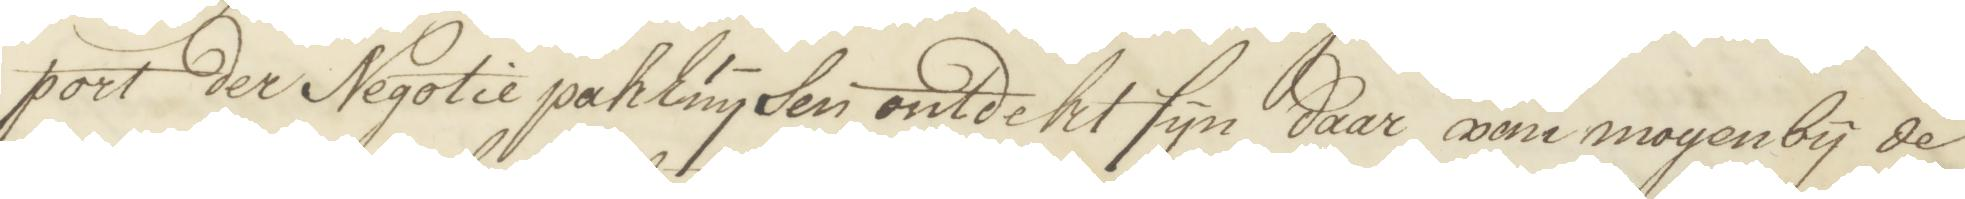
port der Negotie pakhuijsen ontdekt sijn daar van mogen bij de
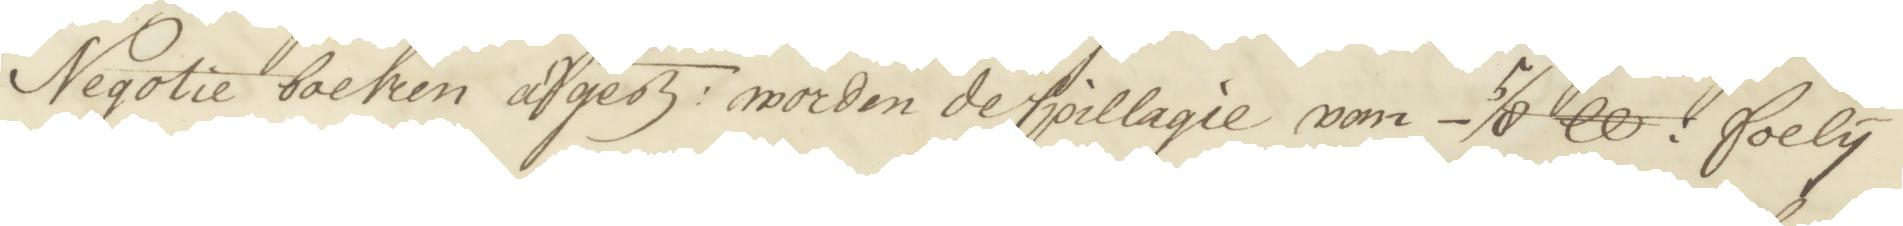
Negotie boeken afgesz: worden de spillagie van - 5/8 lb: foelij
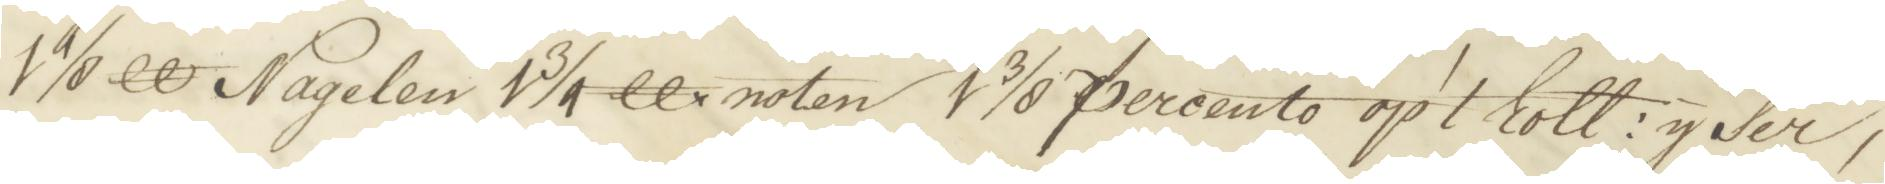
1 1/8 lb Nagelen 1¾ lb: noten 1 3/8 percento op ’t holl: ijser,
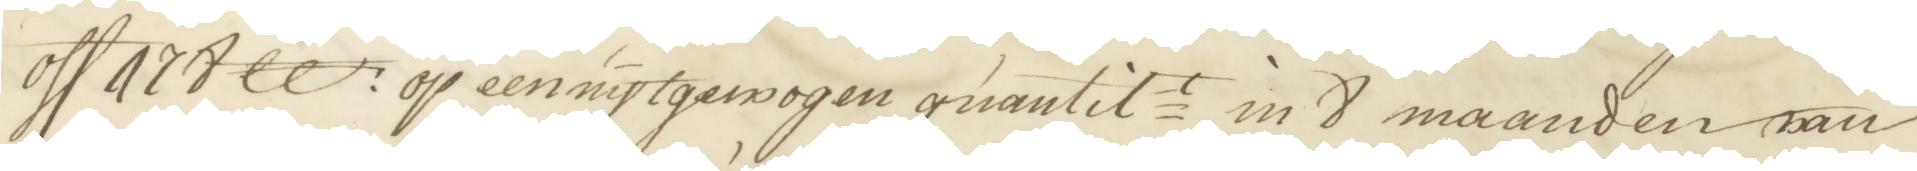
off 478 lb: op een uijtgewogen quantit=t in 8 maanden van
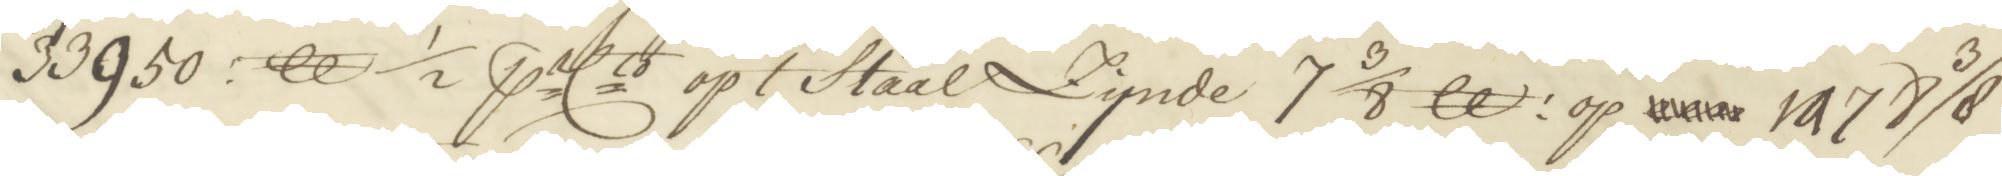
33950: lb ½ p=r C=to op 't staal zijnde 7 3/8 lb: op een 1478 3/8
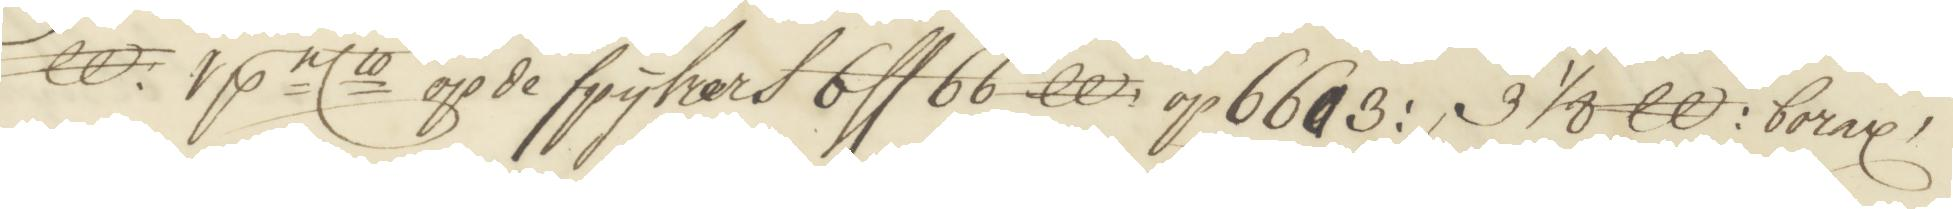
lb: 1 p=r C=to op de spijkers off 66 lb: op 6643: 3 1/8 lb: borax,
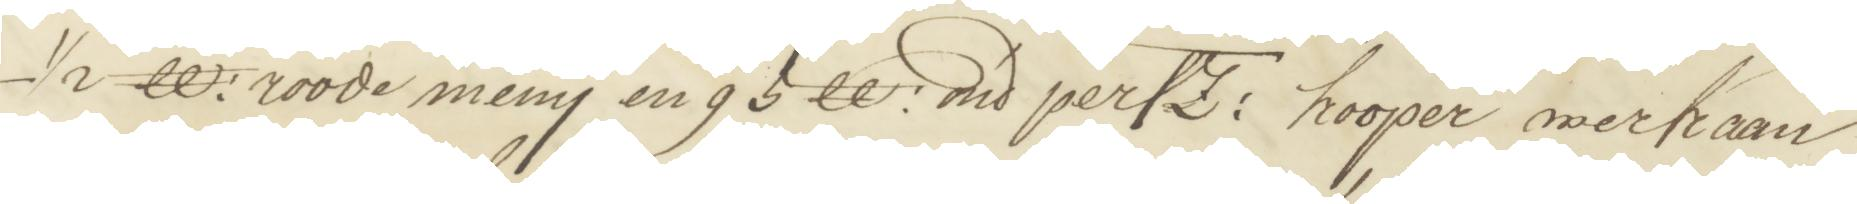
—½ lb: roode menij en 95 lb: oud persz: kooper werk aan
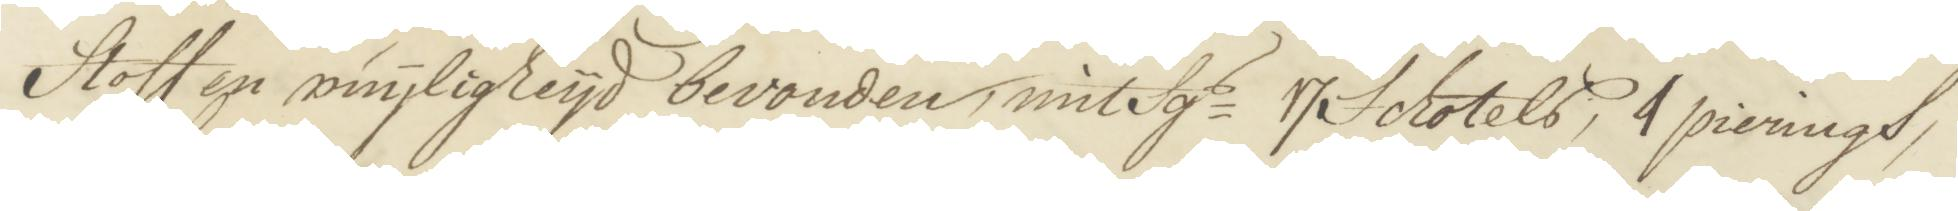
stoff en vuijligheijd bevonden, mitsg=s 17 Schotels, 4 pierings,
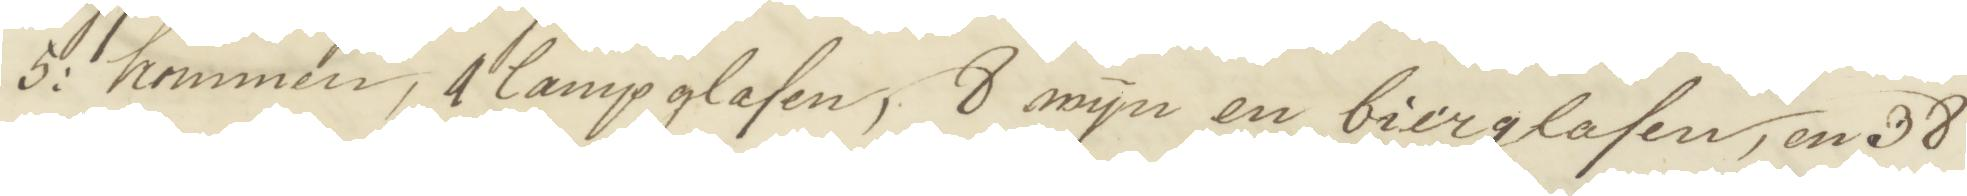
5: kommen, 4 lamp glasen, 8 wijn en bierglasen, en 38
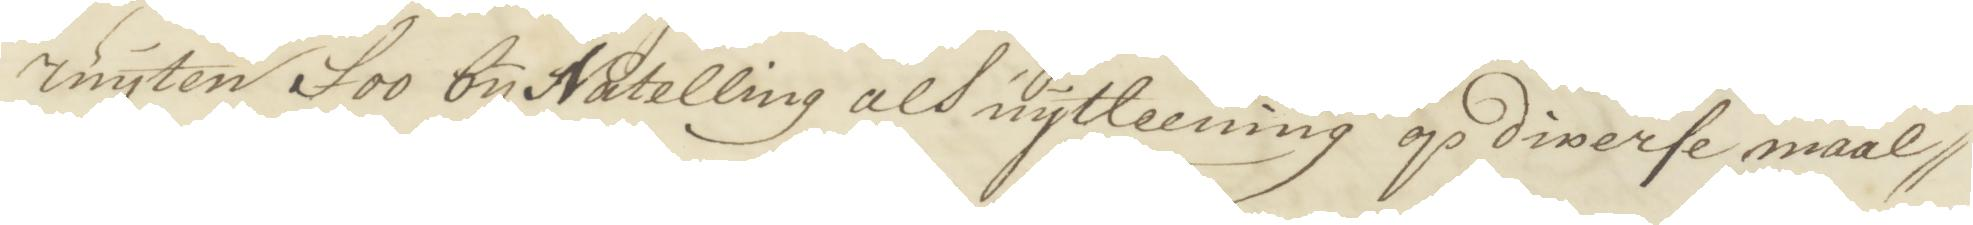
ruijten soo bij Natelling als uijtleening op diverse maal„
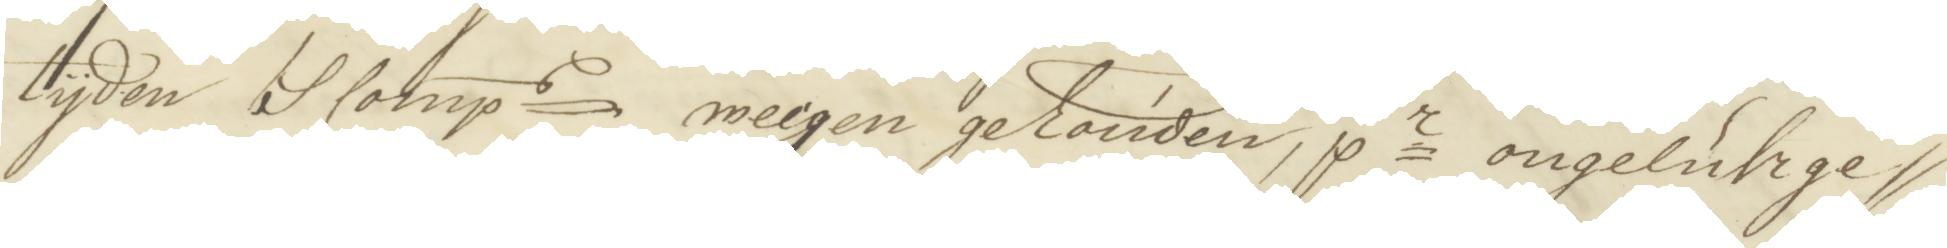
tijden ’s Comp=s weegen gehouden, p=r ongeluk ge„
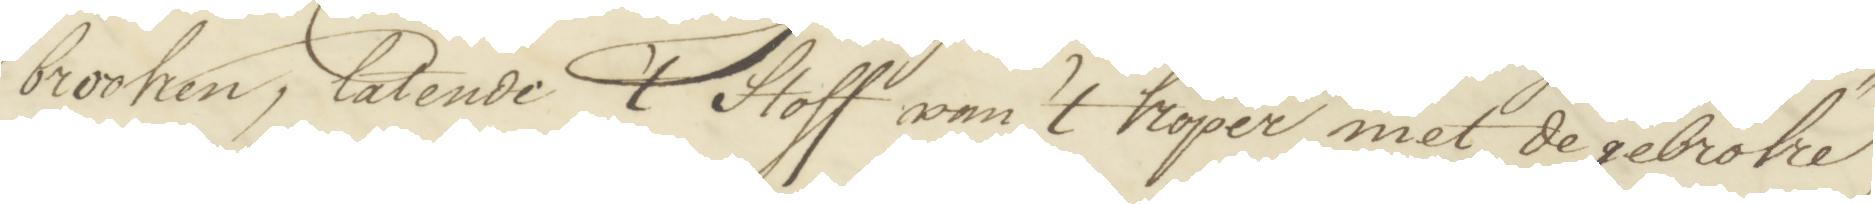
brooken, latende ’t stoff van ’t koper met de gebroke
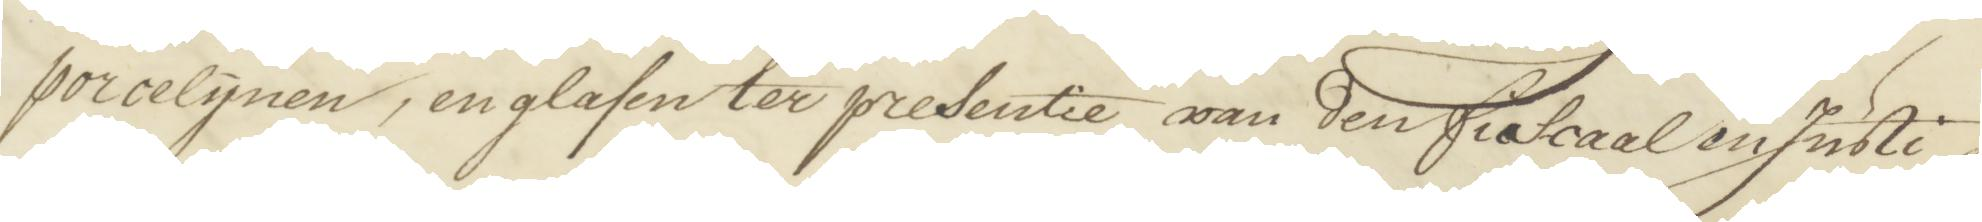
porcelijnen, en glasen ter presentie van den fiscaal en Justi„
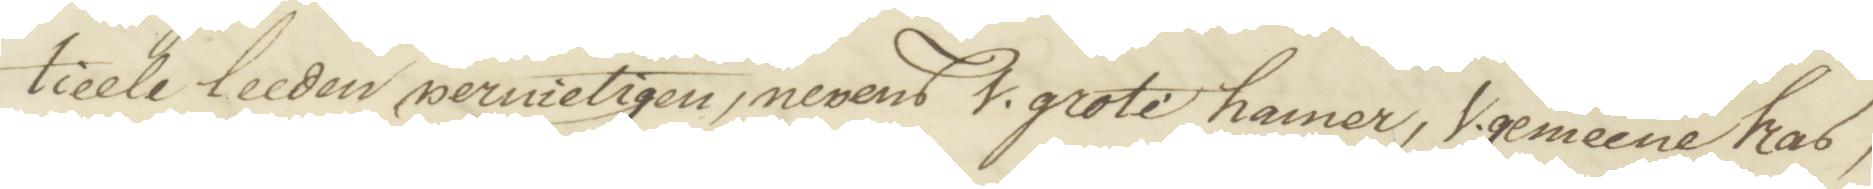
tieele leeden vernietigen, nevens 1. grote hamer, 1. gemeene kas,
